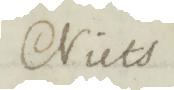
Niets
